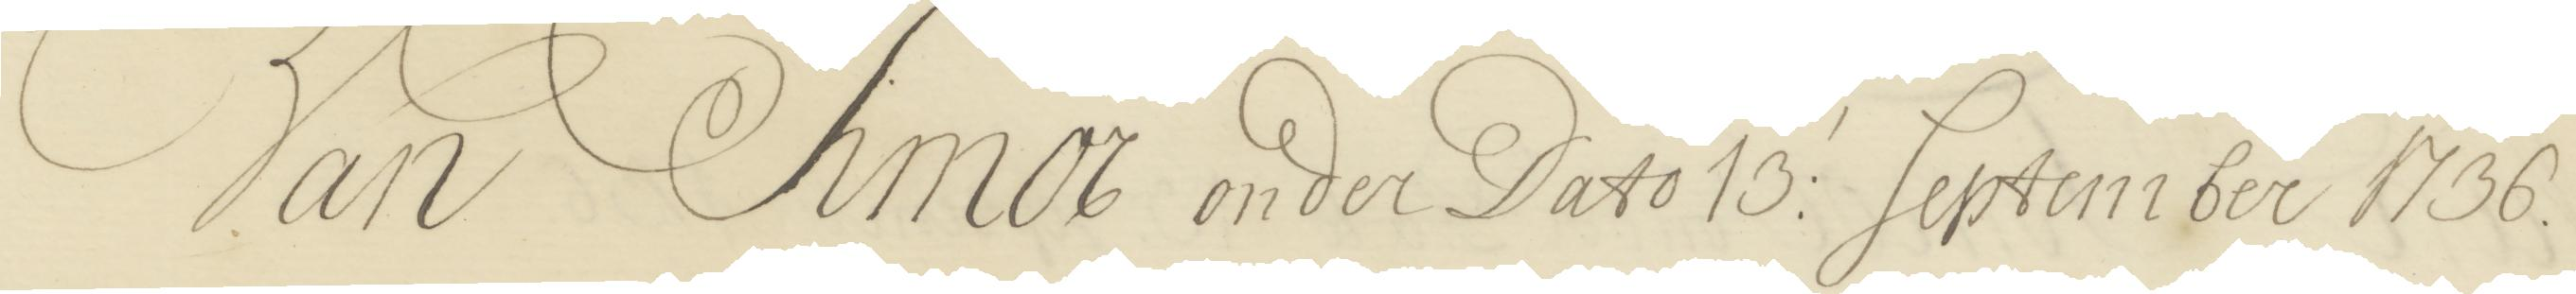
Van Timor onder Dato 13:' september 1736.
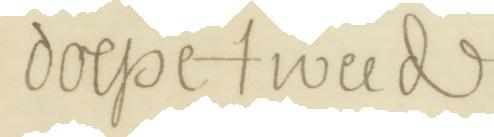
dolpe tweede
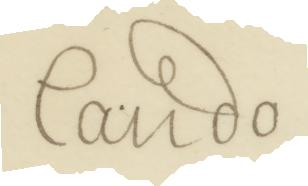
Lando
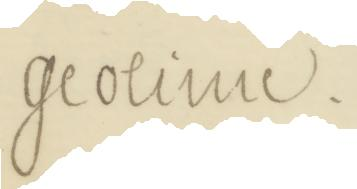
geolime.
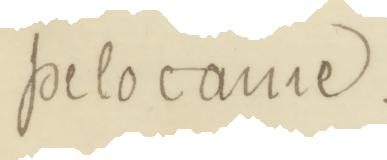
pelocame
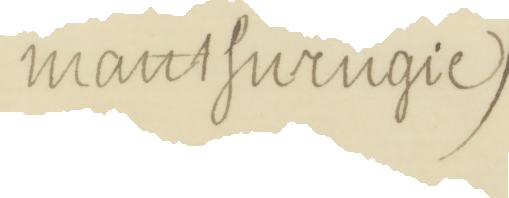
mantsurugie
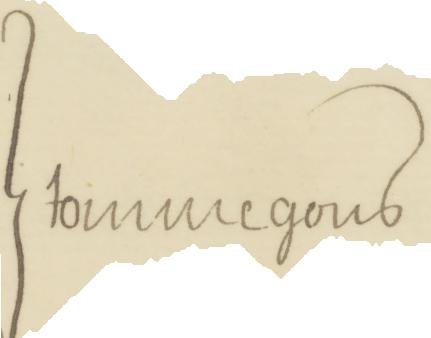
}tommegons
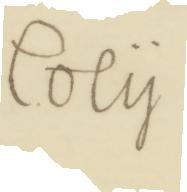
Lolij
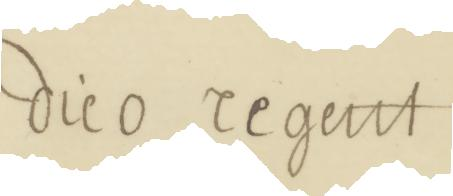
dieo regent
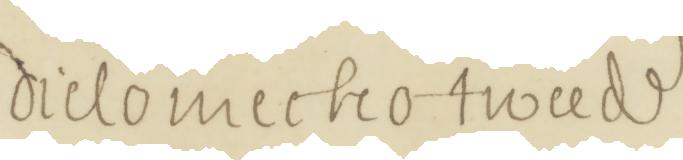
dielo mecko tweede
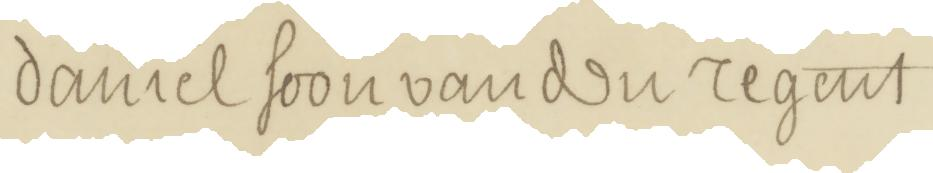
daniel soon van den regent
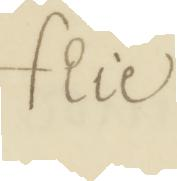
fhie
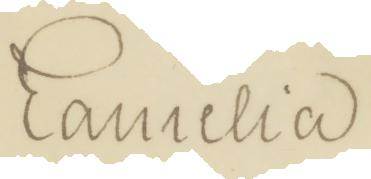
hamelia
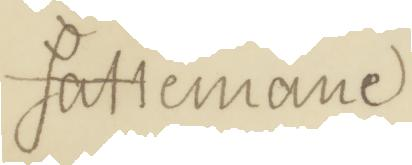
sattemane
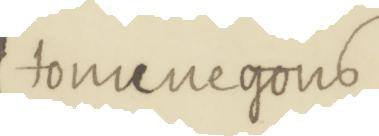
tommegons
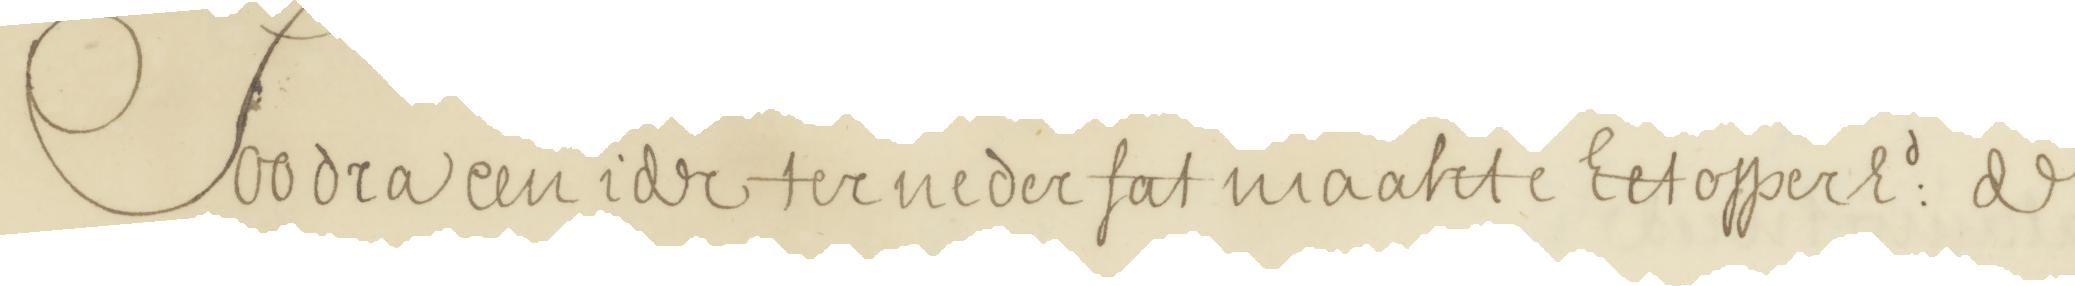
Soodra een ider ter neder sat maakte het opperh:d de
